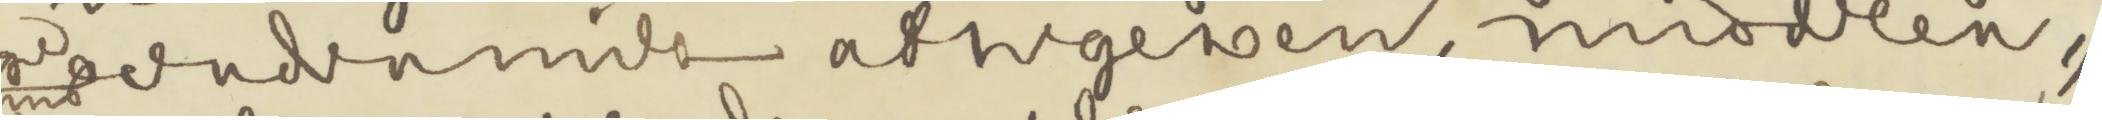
voerden net aftegeven, middeler„
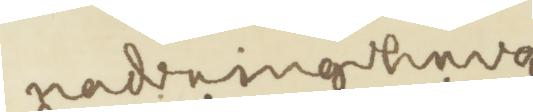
nader ingekrege
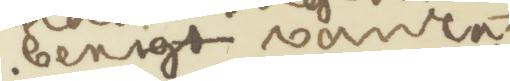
berigt van rams
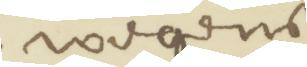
jent wegens't
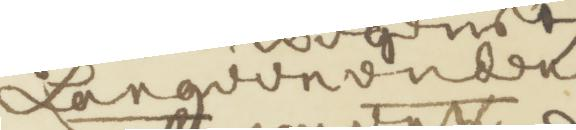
Largeeren der
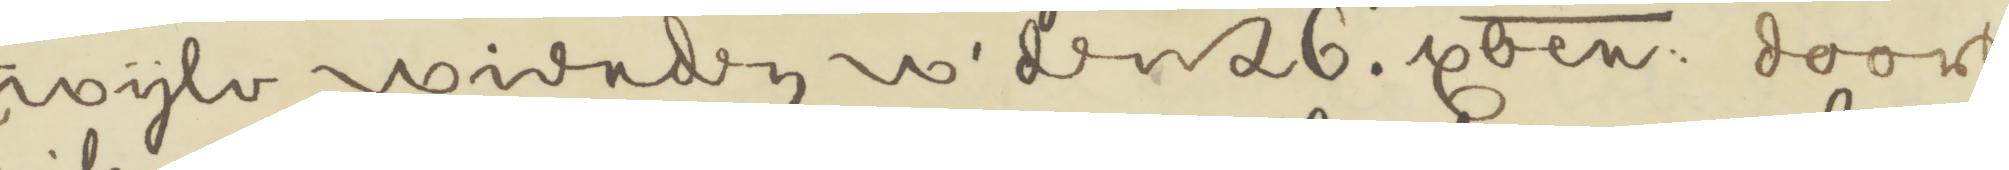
wijle wierden w' den 26. xber: door
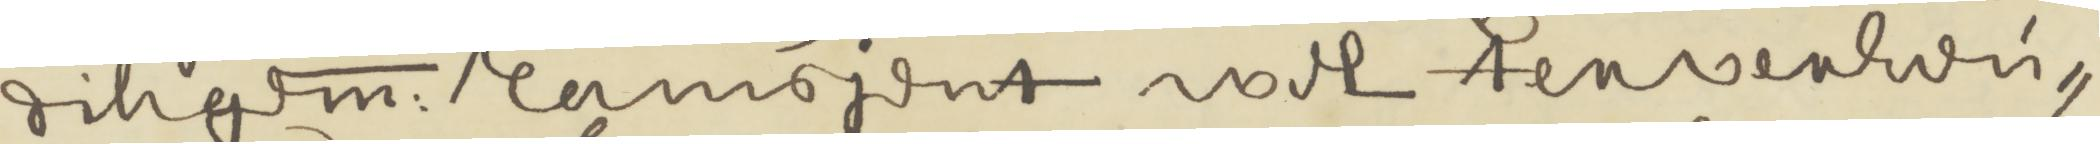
dikgem: ramsjent wel ter verheu„
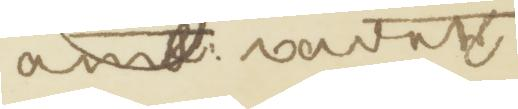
amb: vaertver
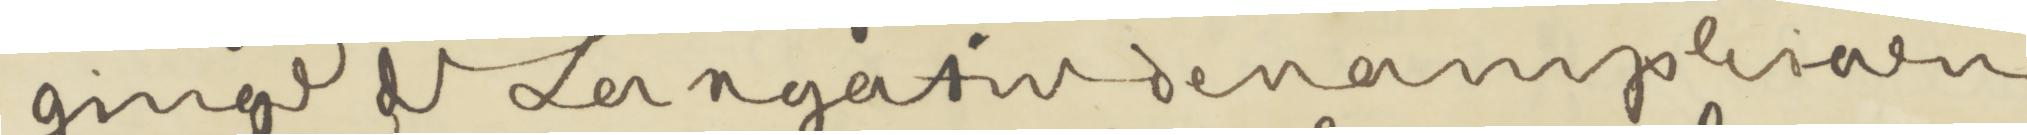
ginge de Largatie den amphioen
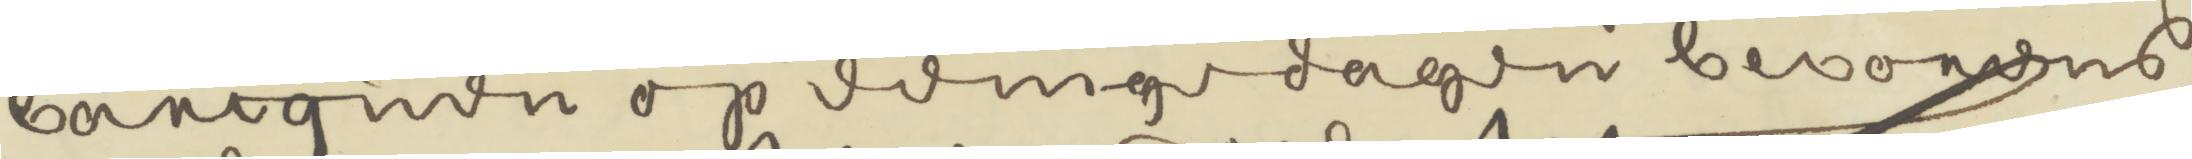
barcquen op eenige dagen bevorens
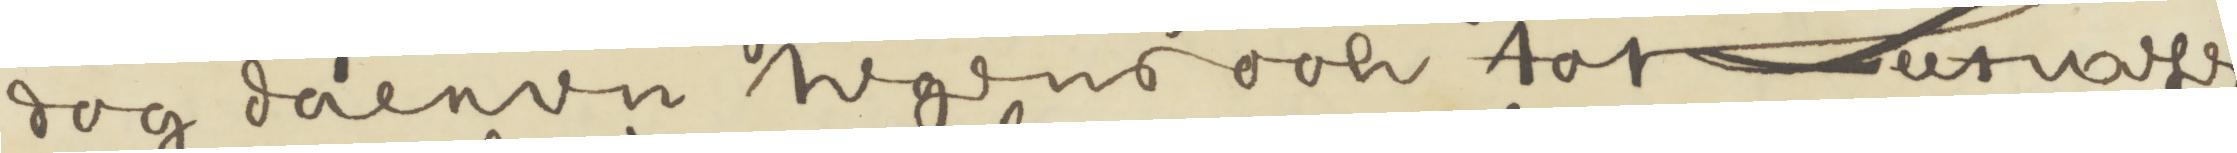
dog daeren tegens ook tot Leetwesen
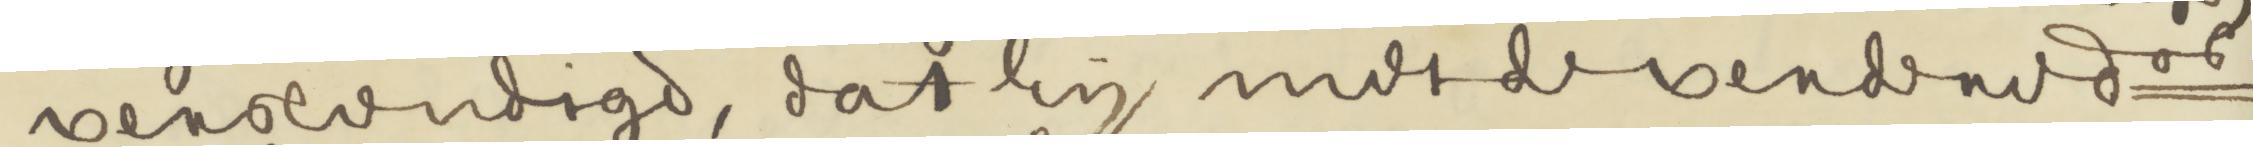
verstendigd, dat hij met de verdere d=os
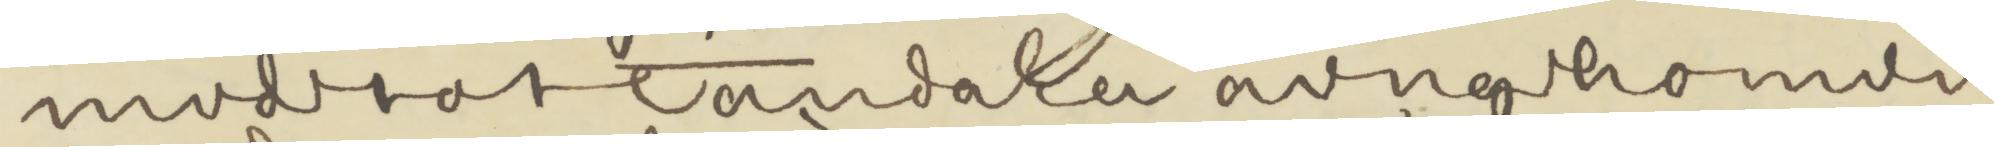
mede tot Candaha aengekomen
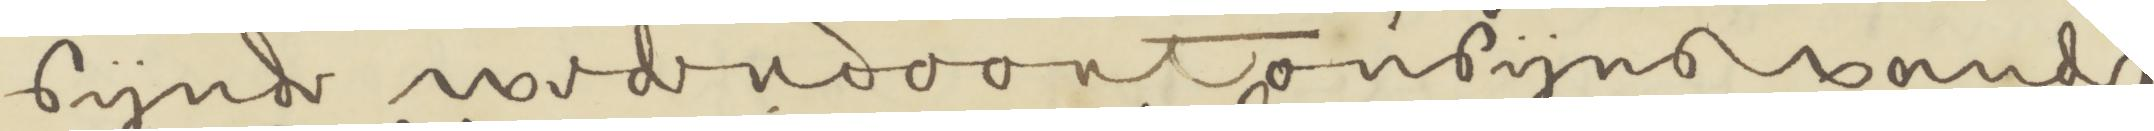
sijnde wederdoor Cousijns vanden
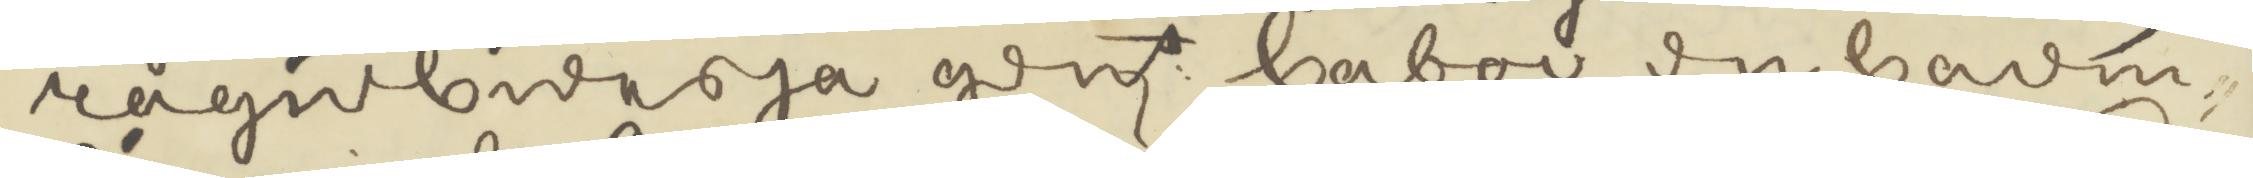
ragiebiersja gen:t baboe en baem„
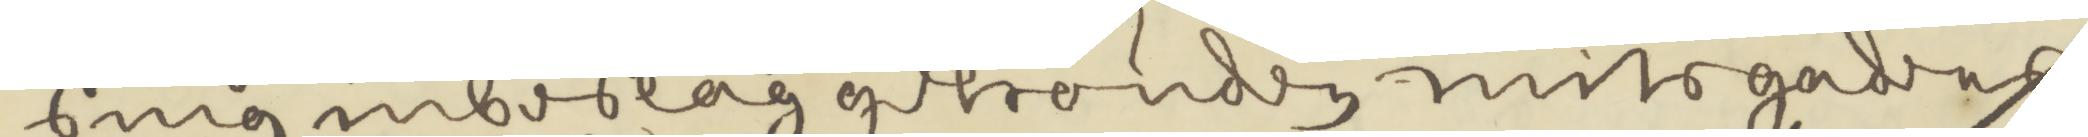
sing inbeslag gehouden mitsgaders
